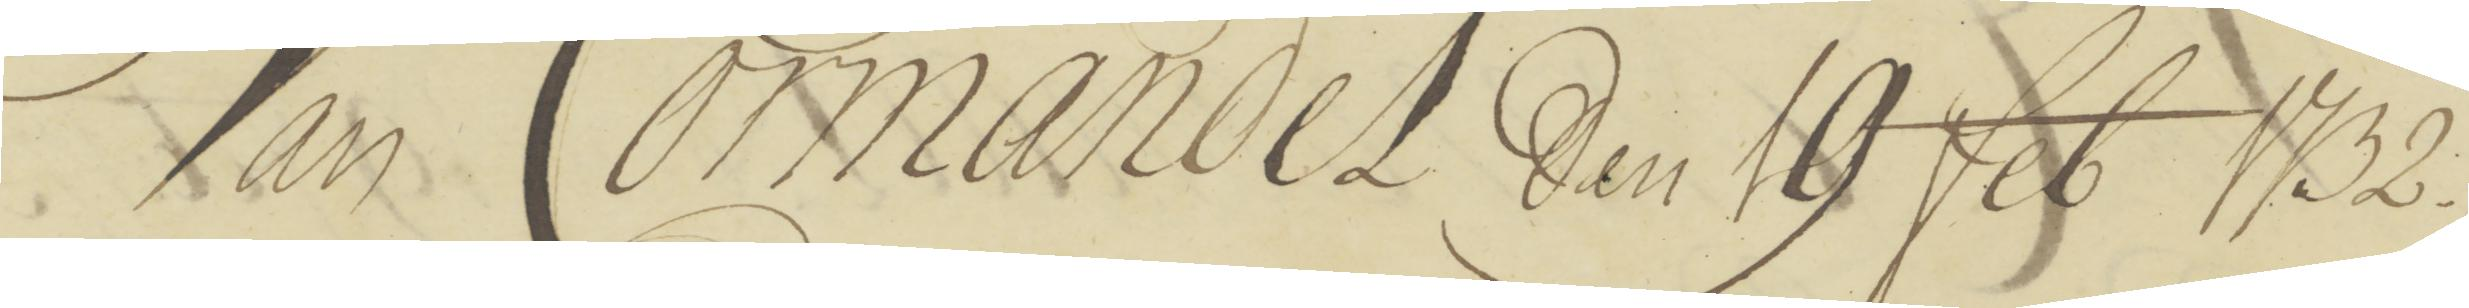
Van Cormandel den 19 feb 1732.
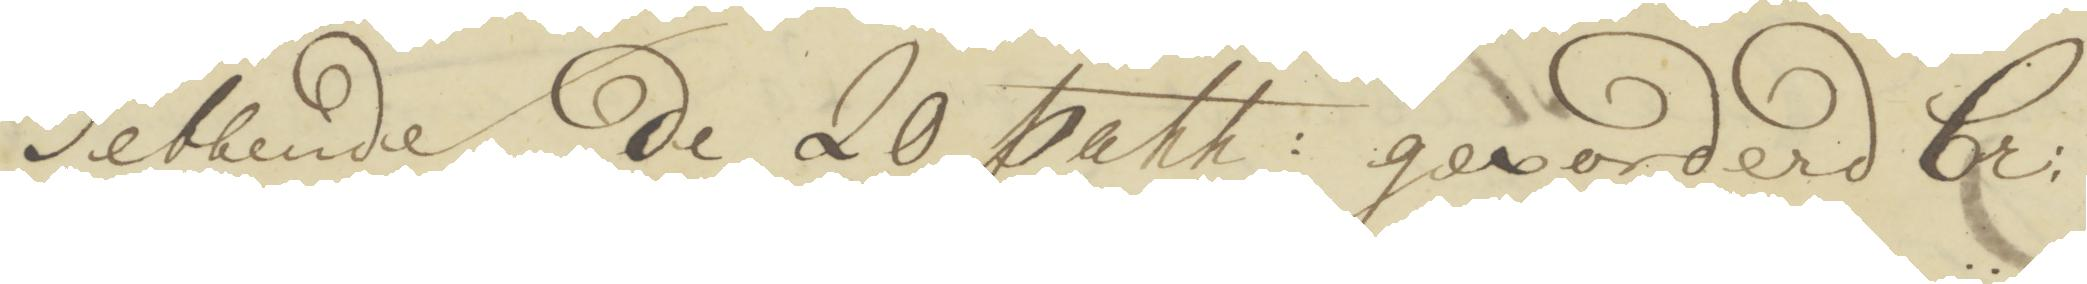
hebbende de 20 pakk: gevorderd br:
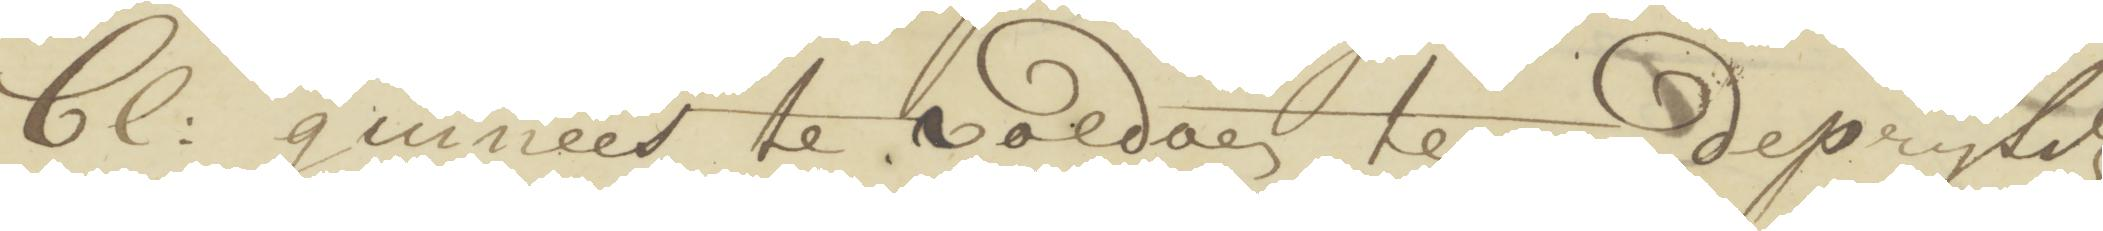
bl: guinees te voldoen teegen de prijsen
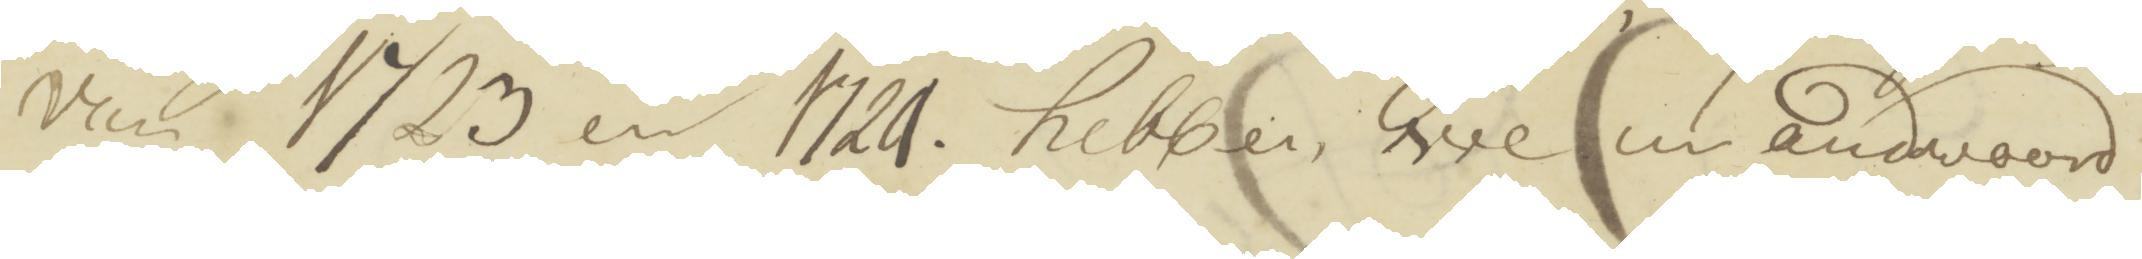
van 1723 en 1724. hebben we in andwoord
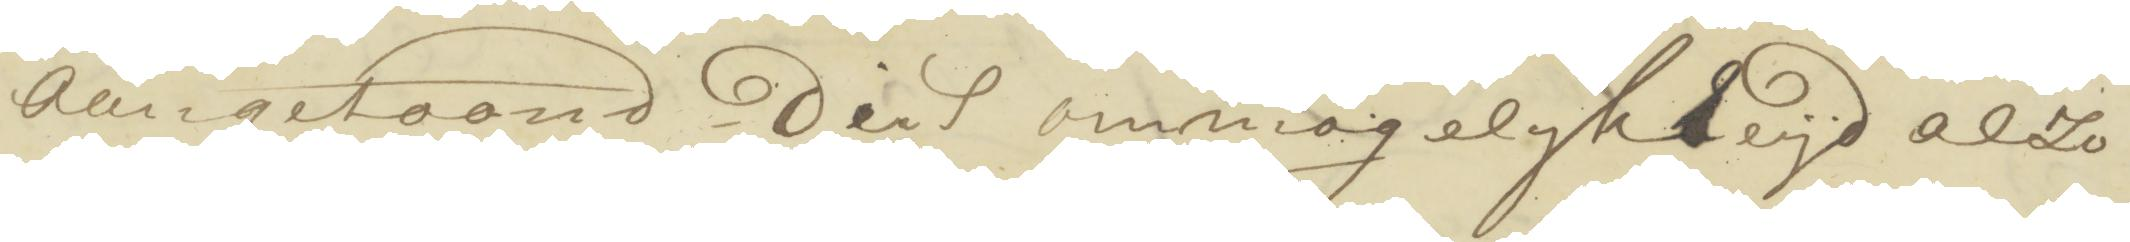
aangetoond dies om mogelykheijd alzo
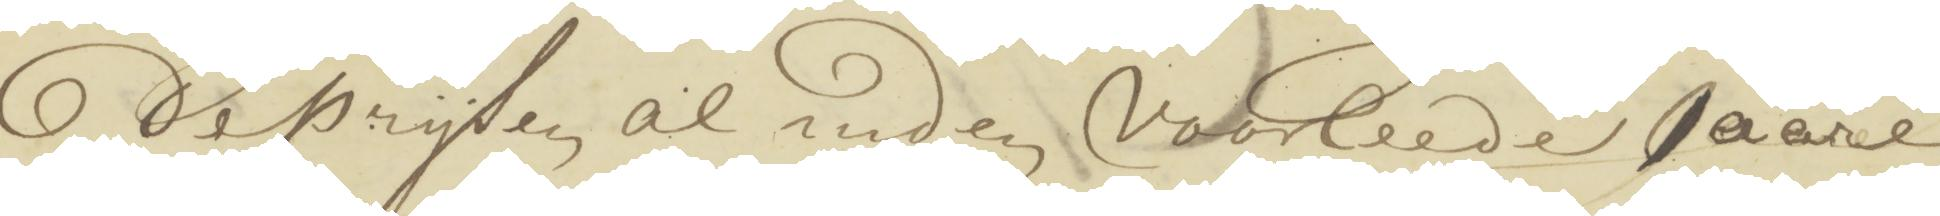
de prijsen al in den voorleede Jaare
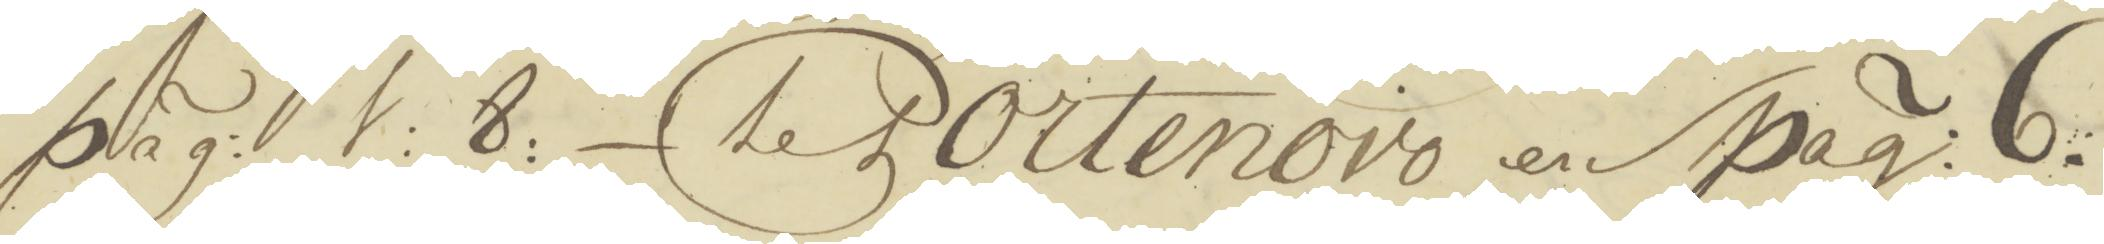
pag: 1: 8: te Portenovo en pag: 6:
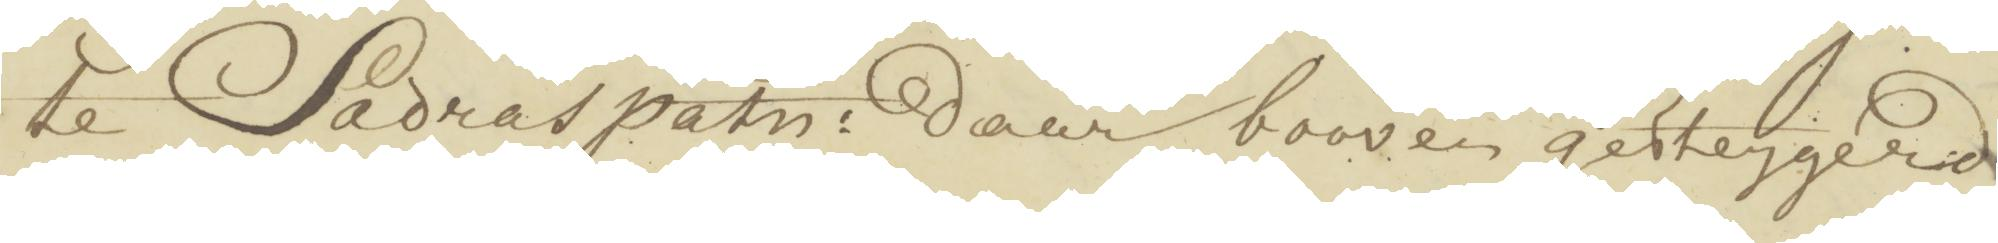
te Sadraspatn: daar booven gesteygerd
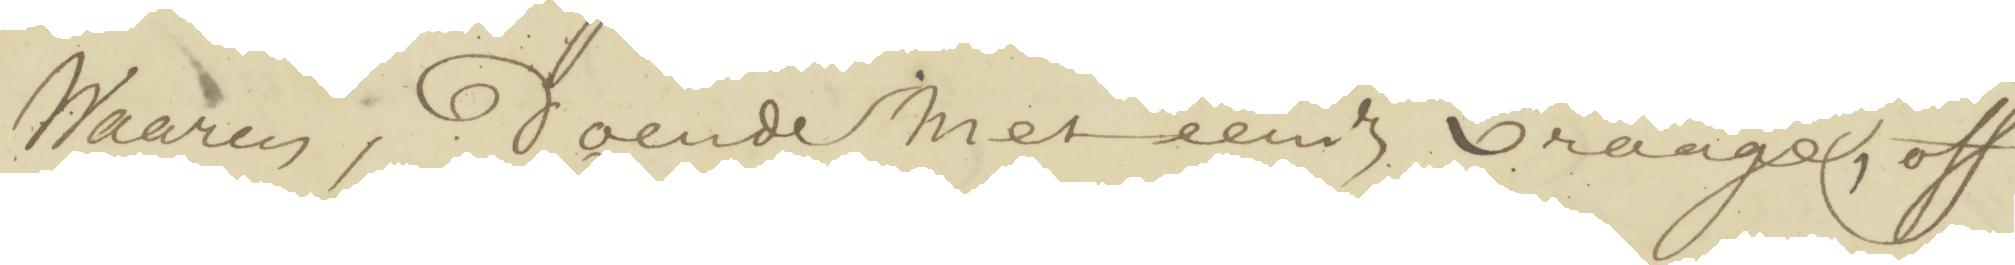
waaren, doende met eenen vraage, off
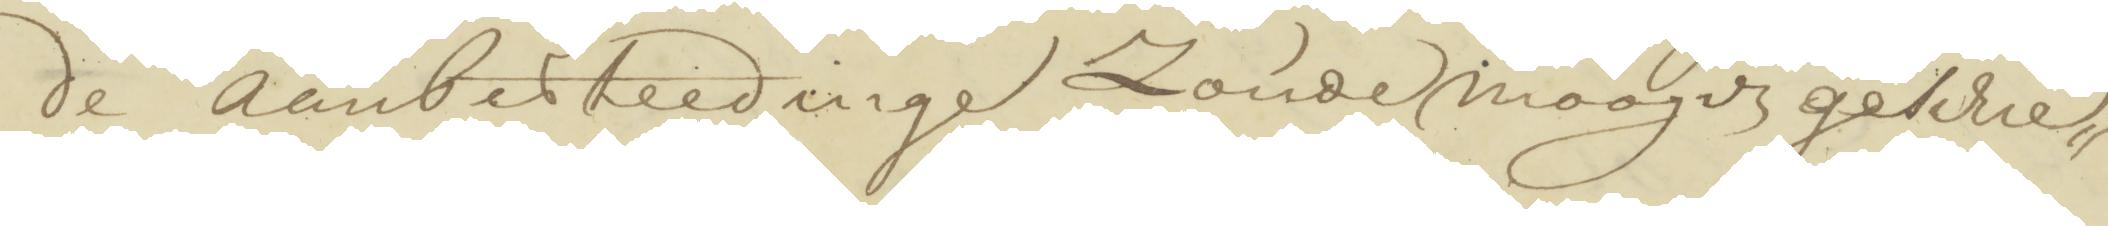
de aanbesteedinge zoude moogen geschie„
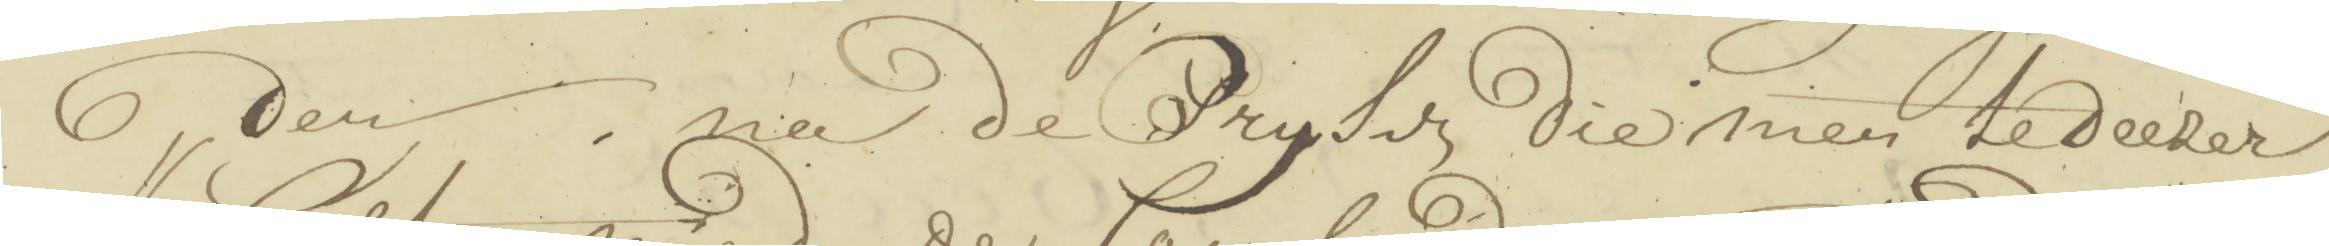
den, na de Prysen die men te deezer
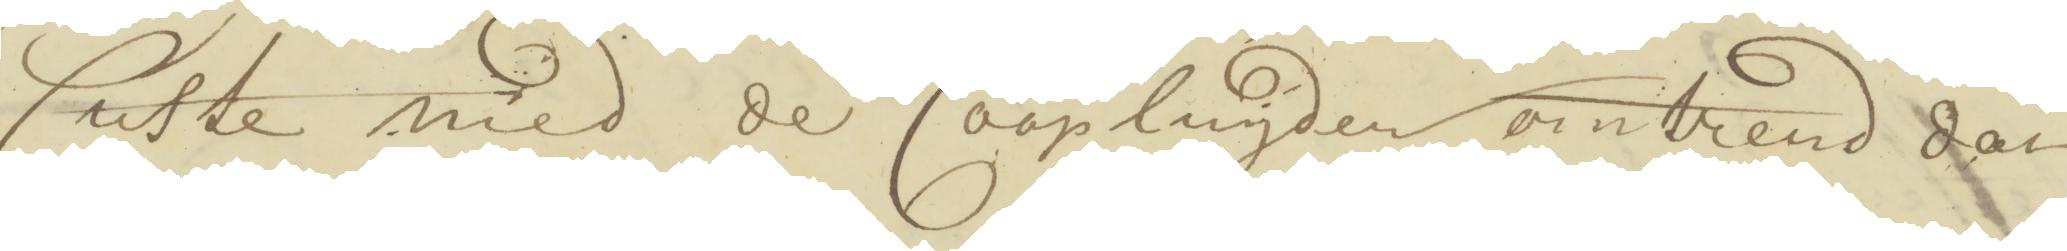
Custe med de Coopluijden omtrend dat
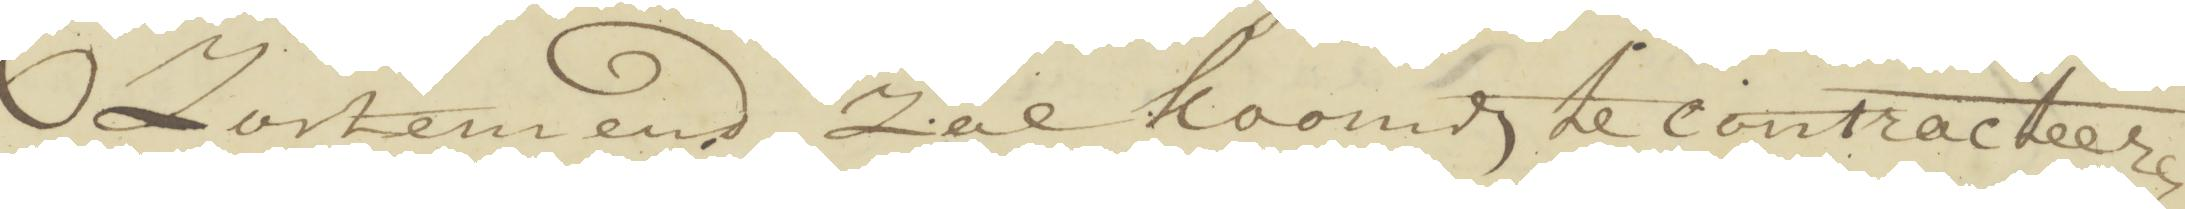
Zortemend zal koomen te contracteeren
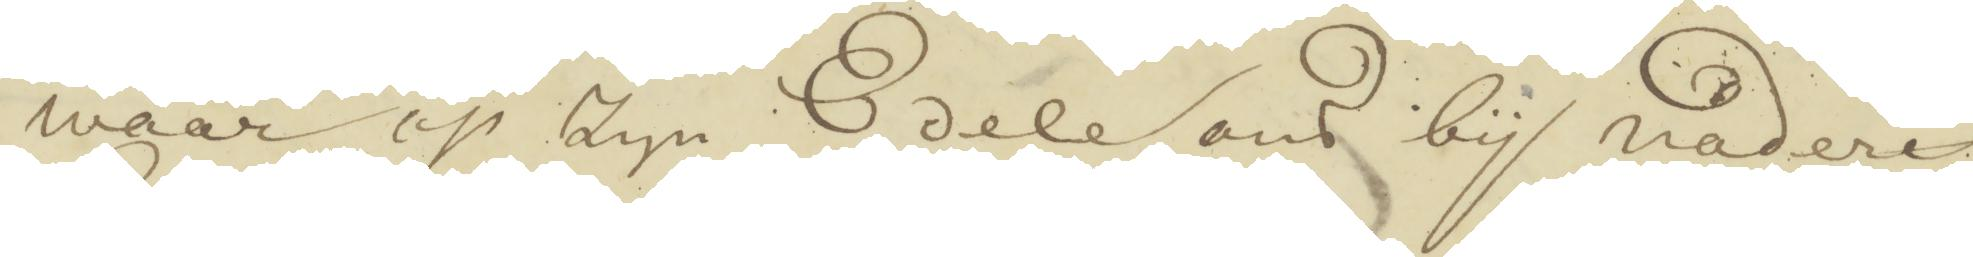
waar op zyn Edele ons bij nadere
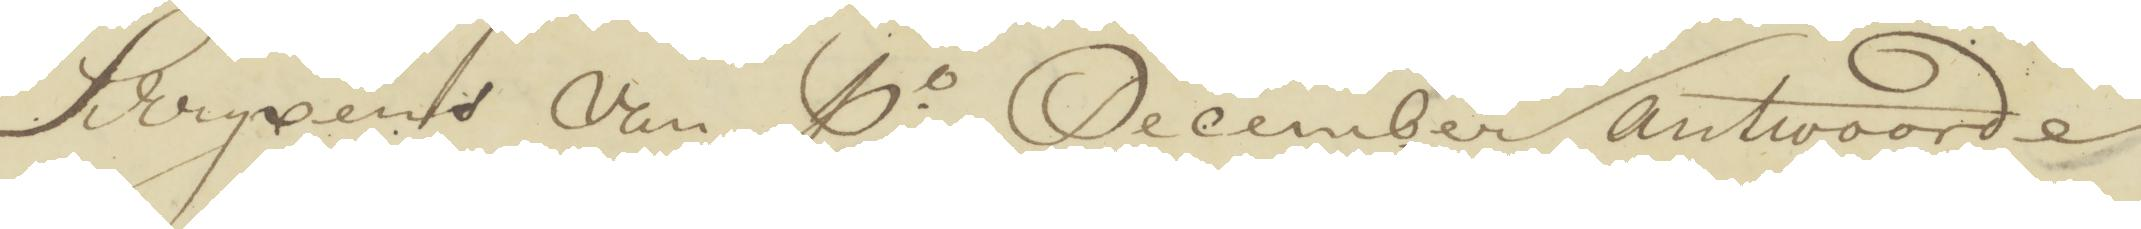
schryvens van p:o December antwoorde
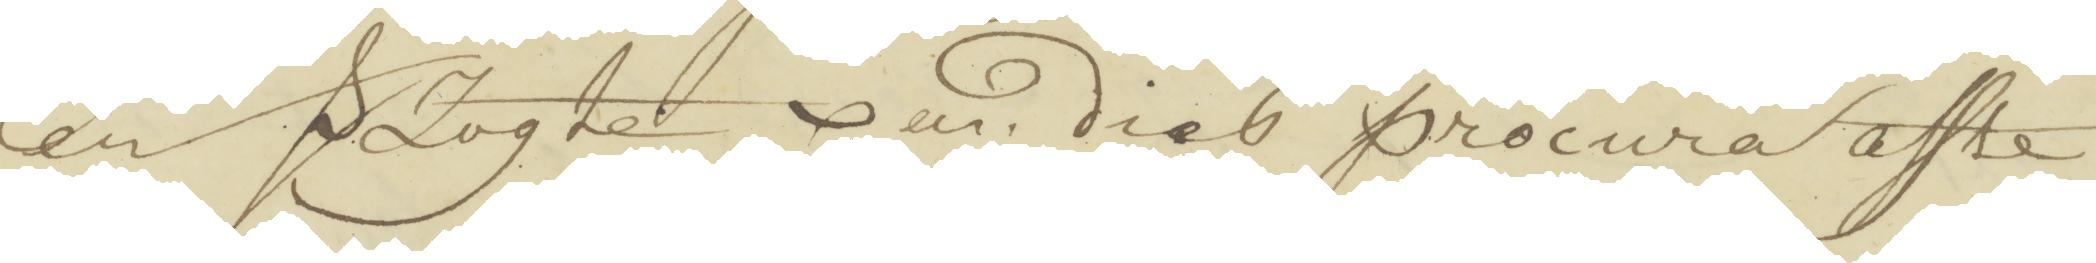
en verzogte van dies procura affte
